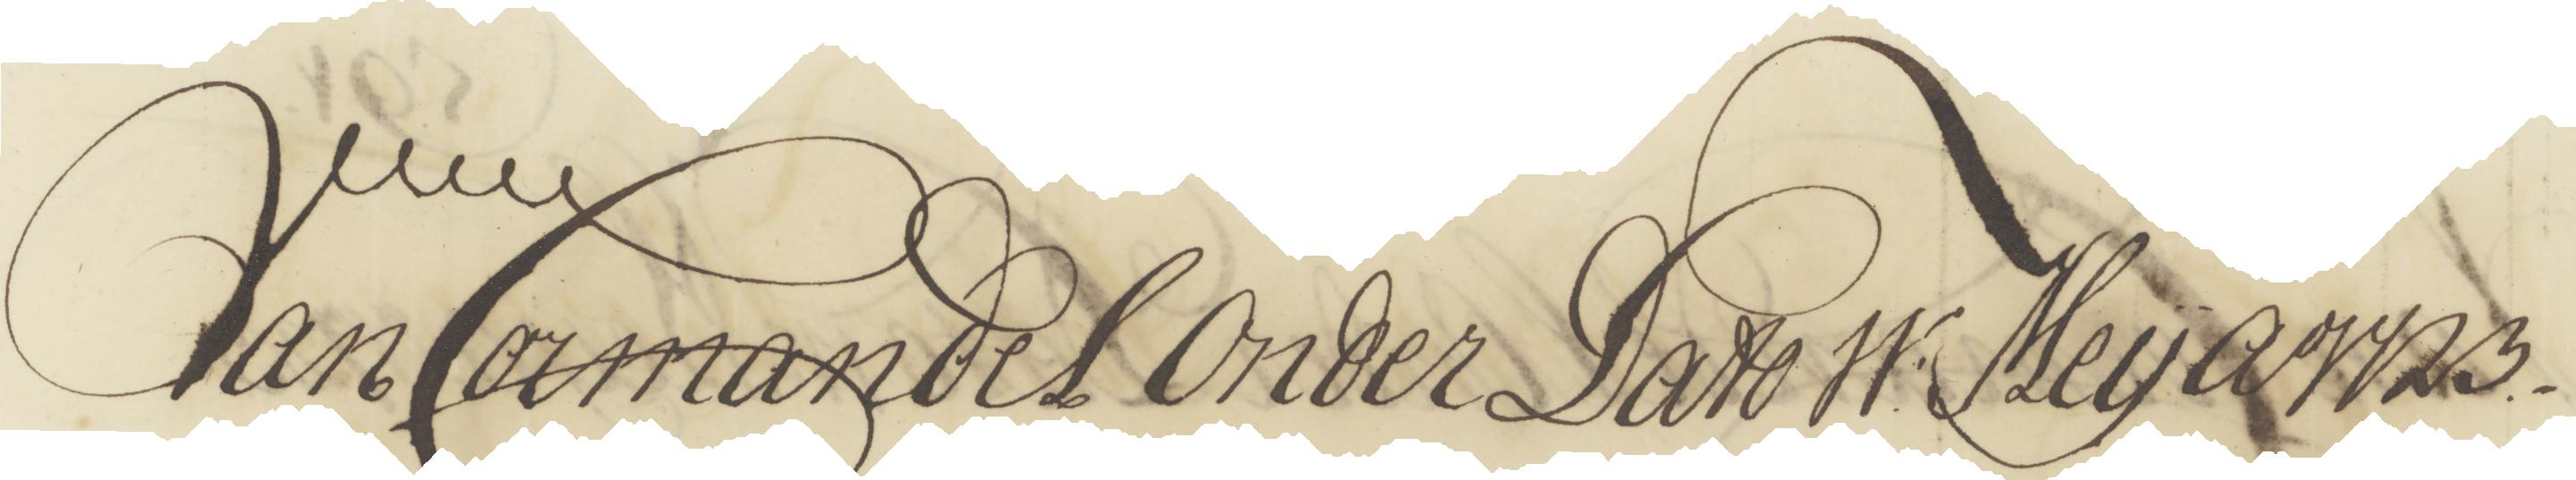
Van Cormandel onder Dato 11:' Meij Ao 1723.
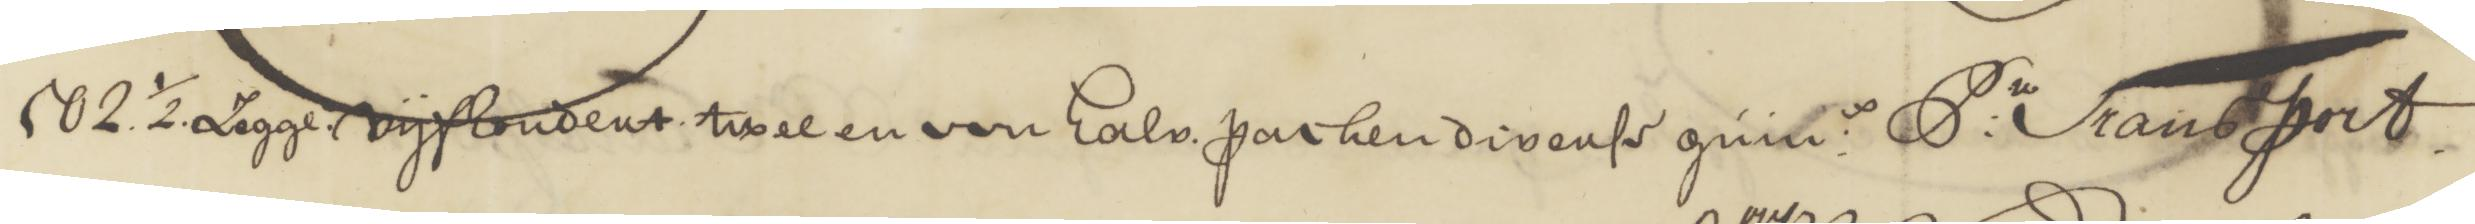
502.½. Zegge vijfhondert twee en een halv. packen diverse guin:s P:r Transport
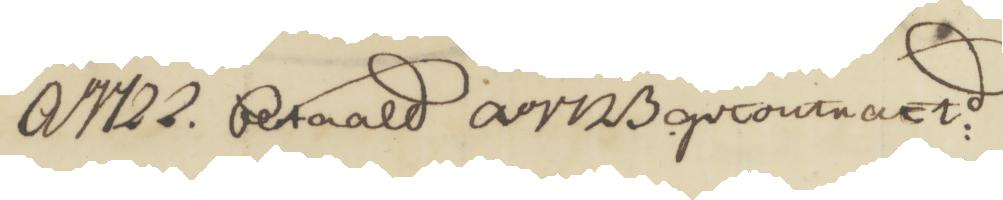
Ao 1722. betaald Ao 1723 gecontract:d
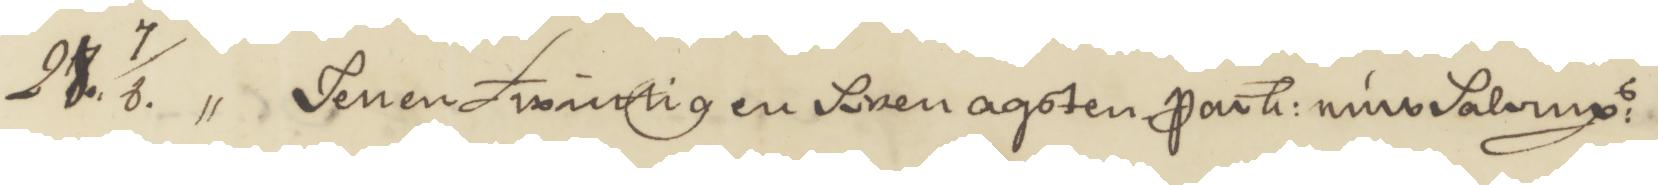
21: 7/8. „ Een en twintig en seven agsten pack: ruw Salemp:s
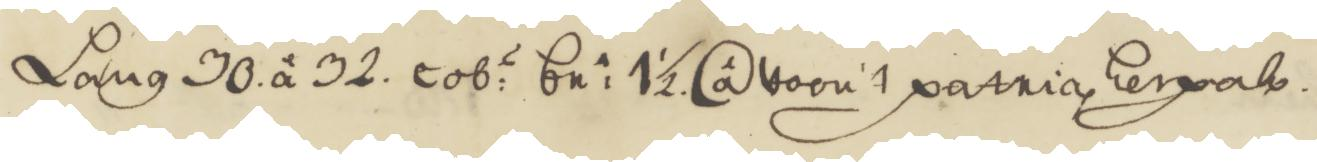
Lang 30. â 32. cob:s br: 1½. à voor ’t patria het pak.
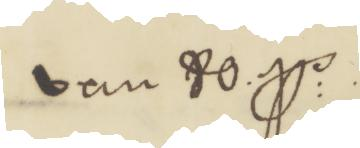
van 80. p:s
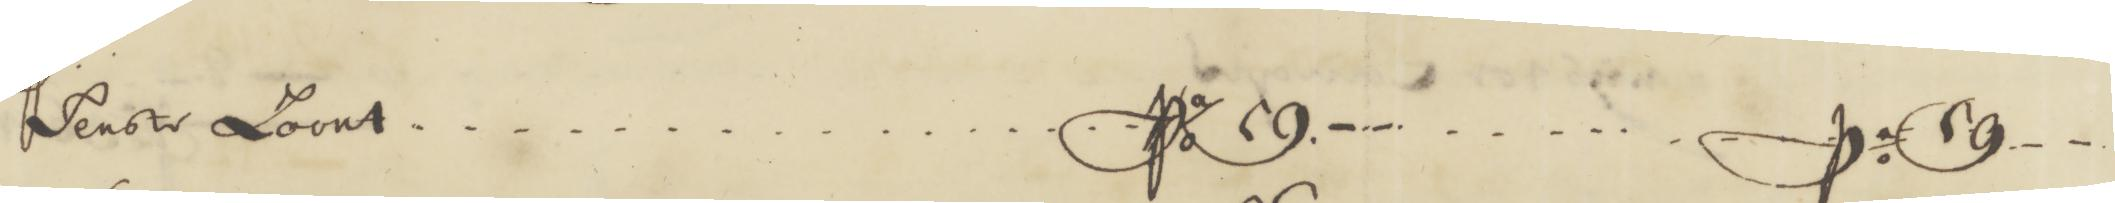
Eerste zoort . . . . . . . . . . . . . . . . p a/o 59.—.—. . . . . . . . . p a/o 59 . - -
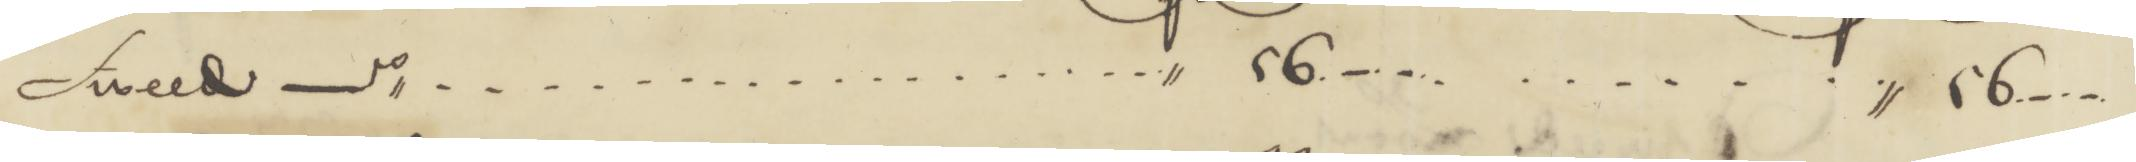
tweede _„o . . . . . . . . . . . . . . . . . . . „ 56.-.-. . . . . . . . . „ 56.- .-.
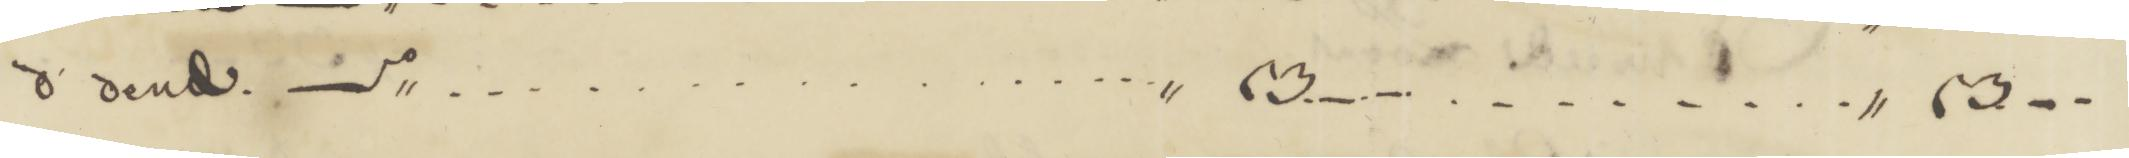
d’ derde. _„o . . . . . . . . . . . . . . . . „ 53.-.-. . . . . . . . „ 53.- -
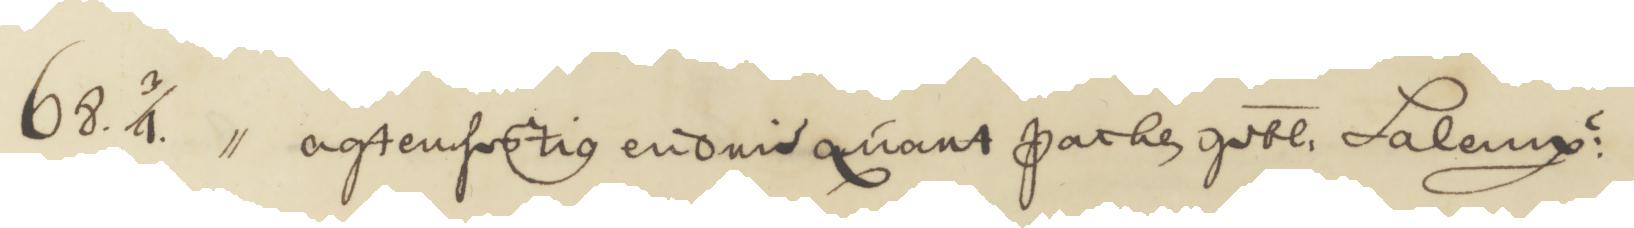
68.¾. „ agtensestig en drie quart packen gebl: Salemp:s
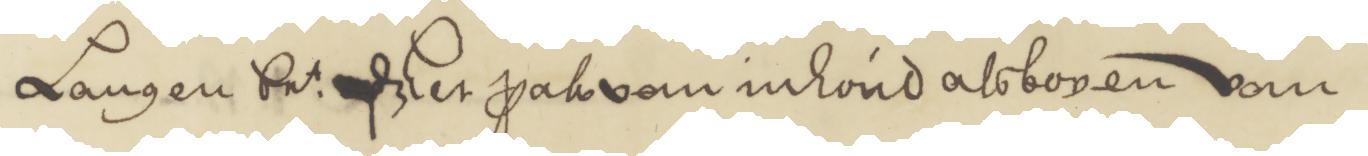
Langen br:t en het pak van inhoud alsboven van
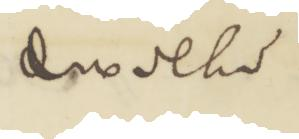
dwelke
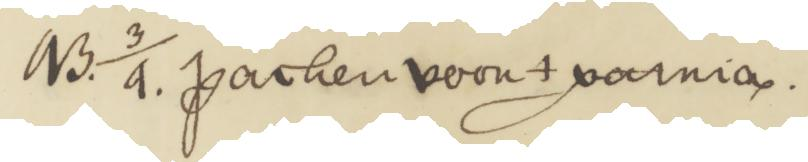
43.¾. packen voor t patria.
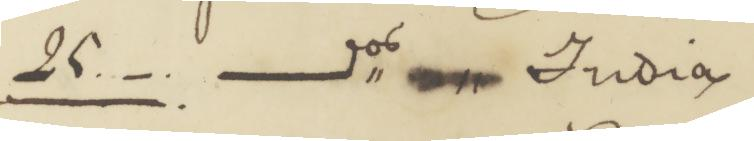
25.–. _„os „ India
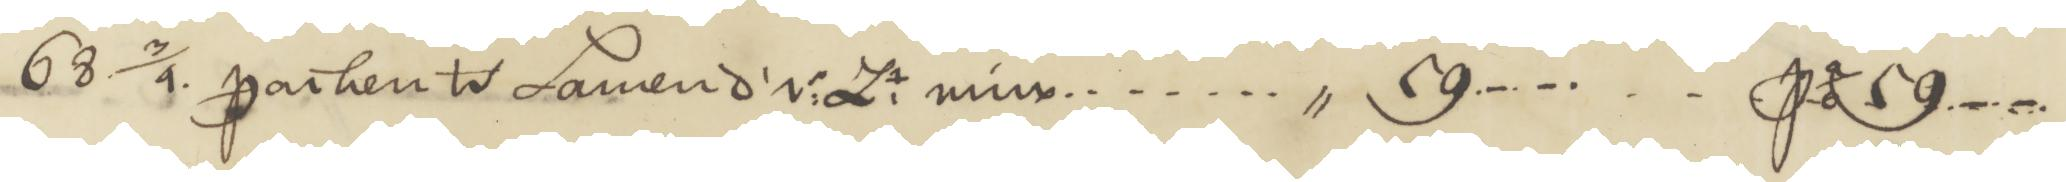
68.¾. packen te samen d’ v: z:t ruw . . . . . . . „ 59.—.—. p. a/o 59.—.—.
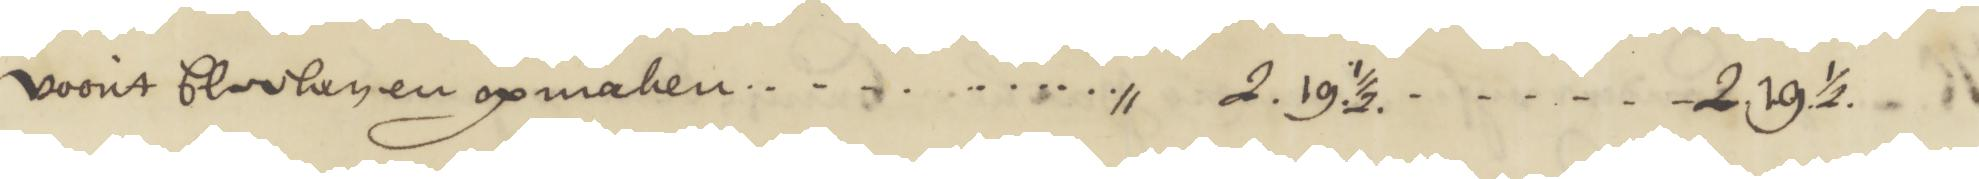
voor't bleeken en op maken . . . . . . . . . . . . „ 2.19.½. . . . . . . 2.19.½.
